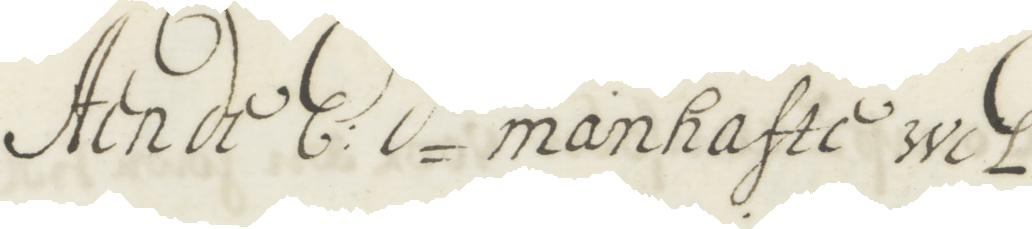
Aen de E: d=le manhafte wel
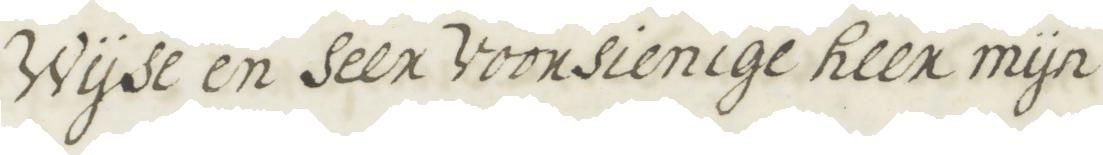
wijse en seer voorsienige heer mijn
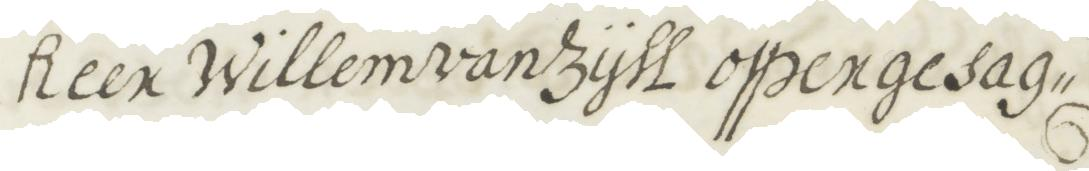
heer willemvanzijll oppergesag„
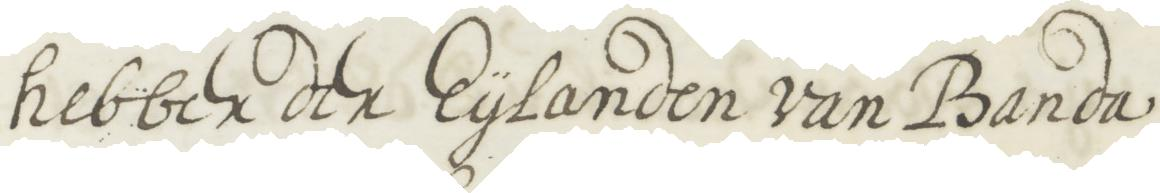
hebber der Eijlanden van Banda
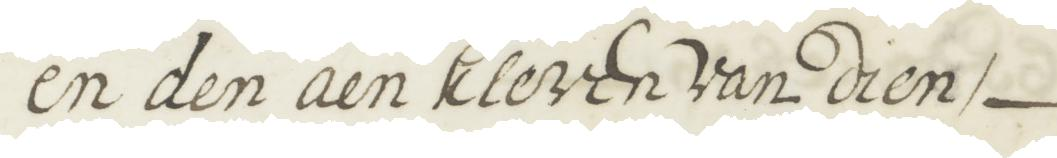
en den aen kleven van dien/ —
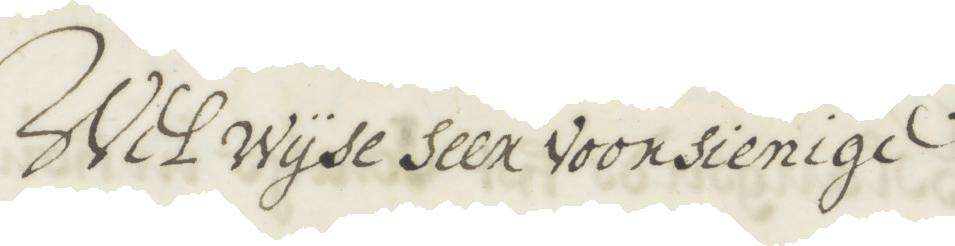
Wel wijse seer voorsienige
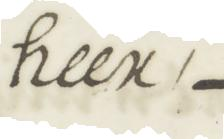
heer/-
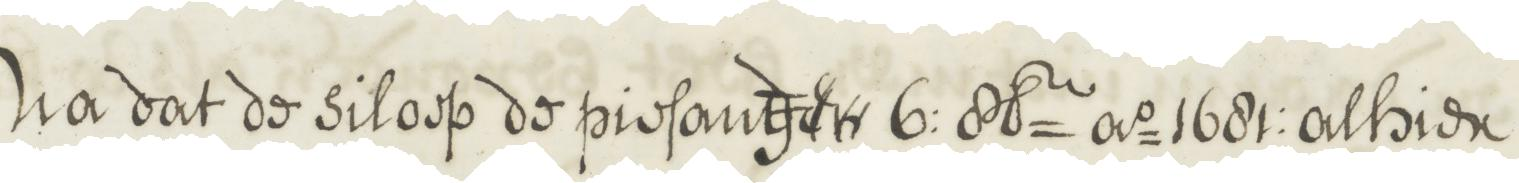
na dat de siloep de piesangch 6: 8b=r a=o 1681: alhier
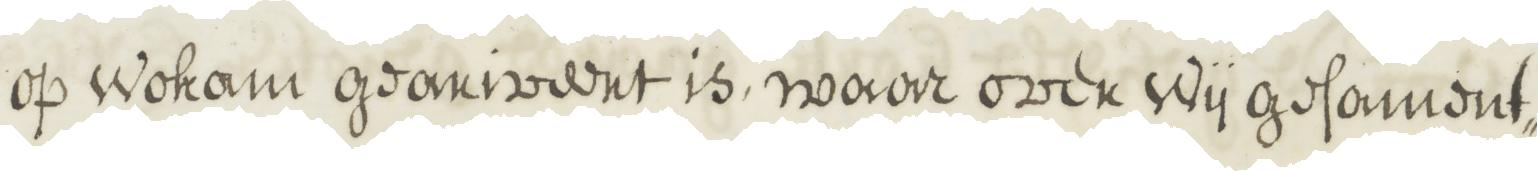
op wokam geariveert is, waar over wij gesament„
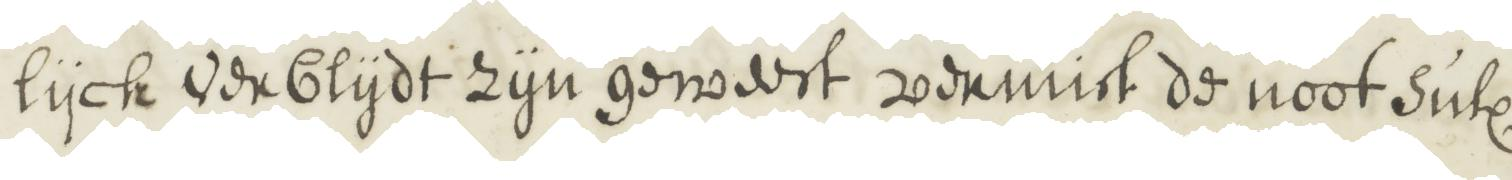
lijck verblijdt zijn geweest vermist de noot sulx
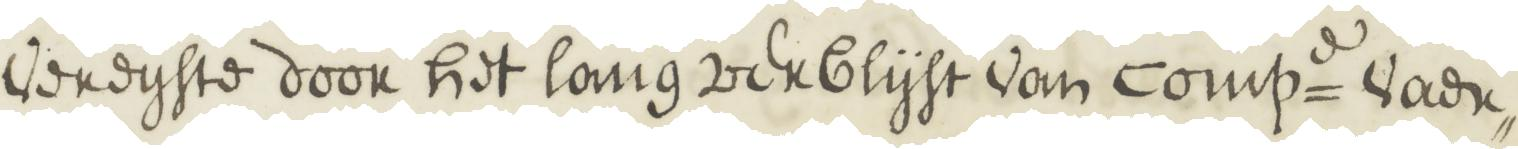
vereijste door het lang verblijft van comp=e vaer„
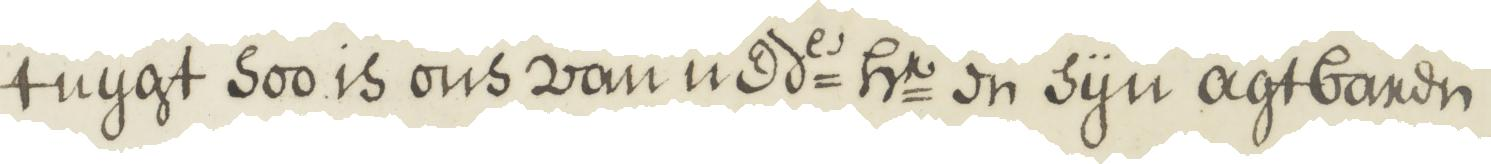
tuijgt soo is ons van uEd=le h=r en sijn agtbaren
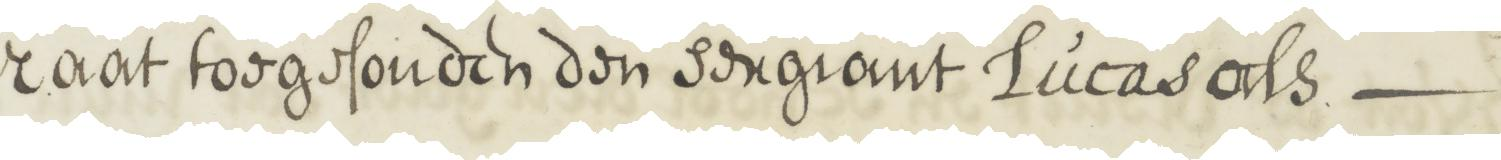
raat toegesonden den sergiant Lucas als —
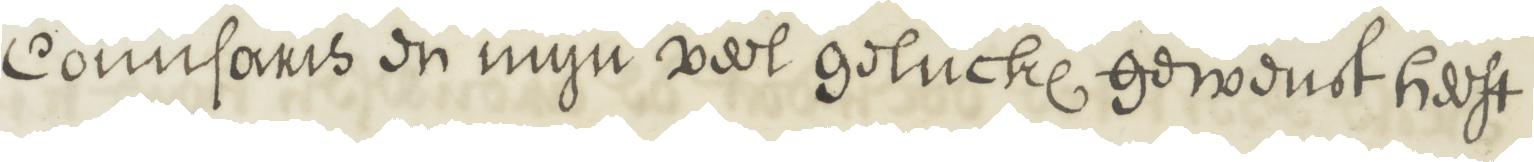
Comisaris en mijn veel gelucke gewenst heeft
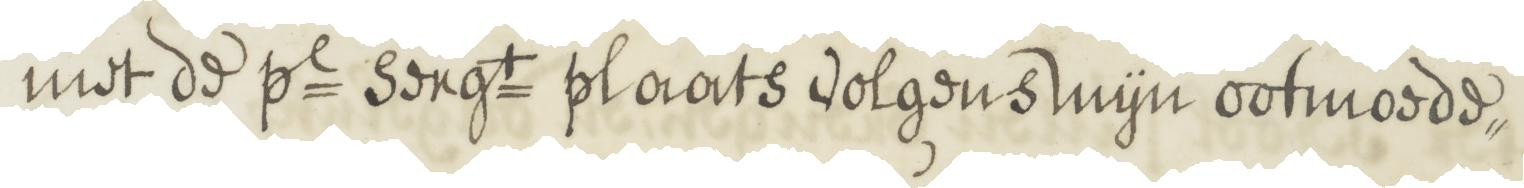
met de p=l serg=t plaats volgens mijn ootmoede„
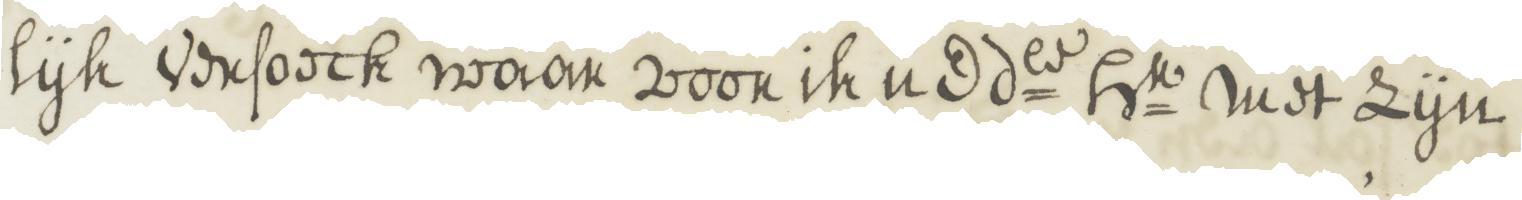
lijk versoeck waar voor ik u Ed=le h=r met zijn
